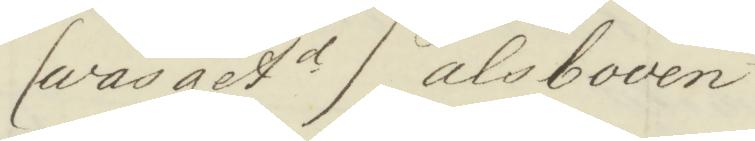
(was get:d ) als boven
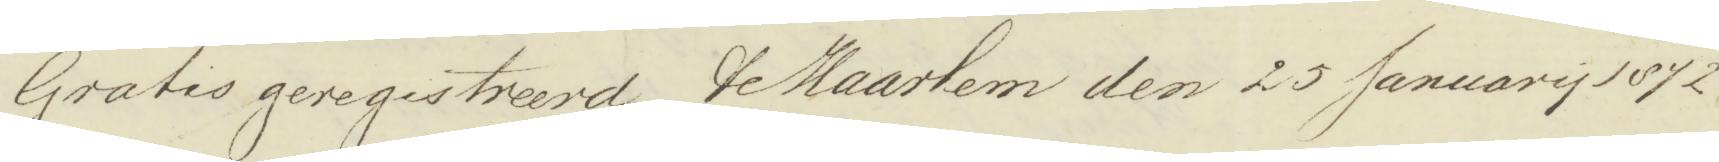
Gratis geregistreerd te Haarlem den 25 Januarij 1872
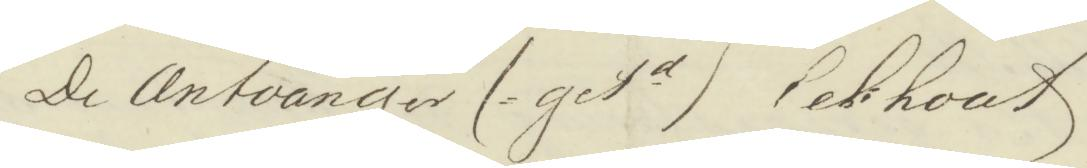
De Ontvanger ( =get:d ) Eekhout
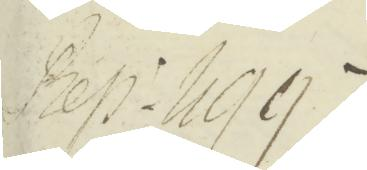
Rep: 4997
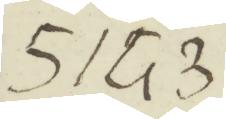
5143
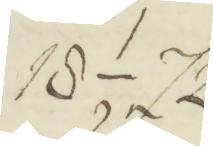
18 1/23 72
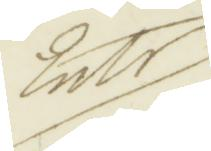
Entr.
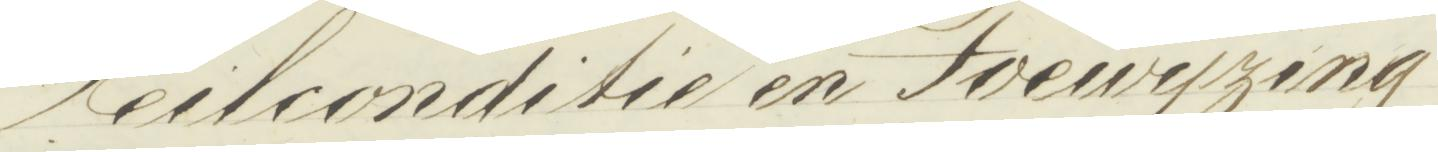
Veilconditie en Toewijzing
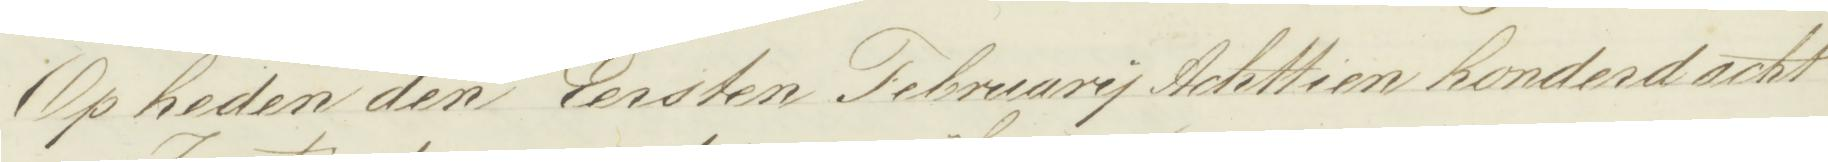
Op heden den Eersten Februarij Achttien honderd acht
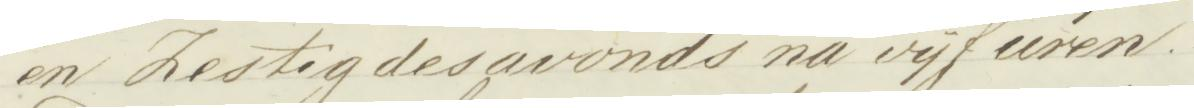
en Zestig des avonds na vijf uren.
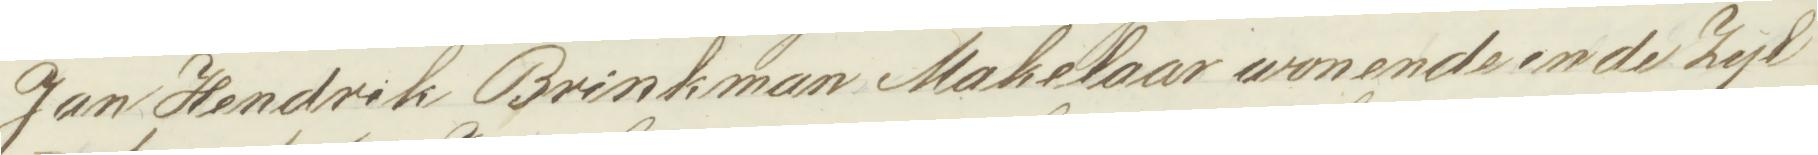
Jan Hendrik Brinkman Makelaar wonende in de Zijl
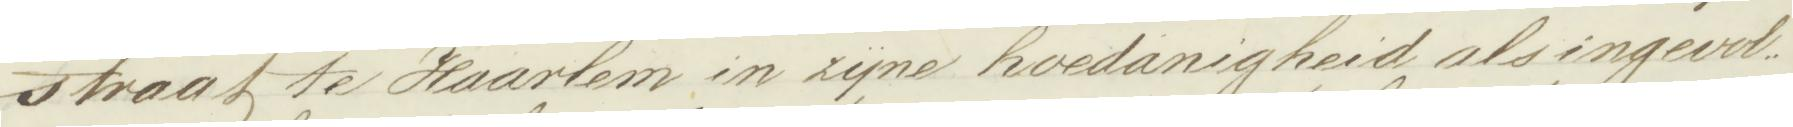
straat te Haarlem in zijne hoedanigheid als ingevol„
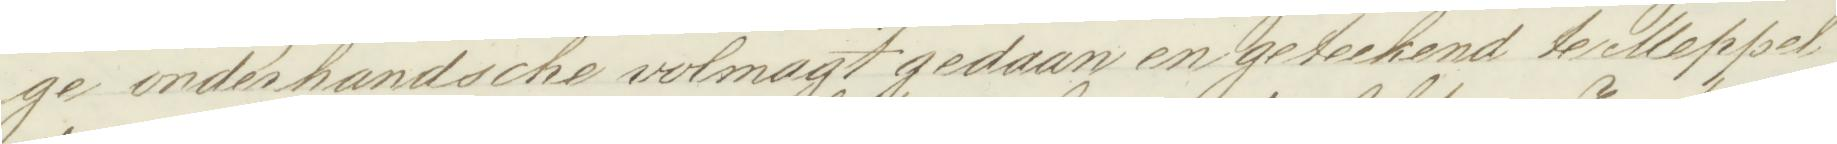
ge onderhandsche volmagt gedaan en geteekend te Meppel
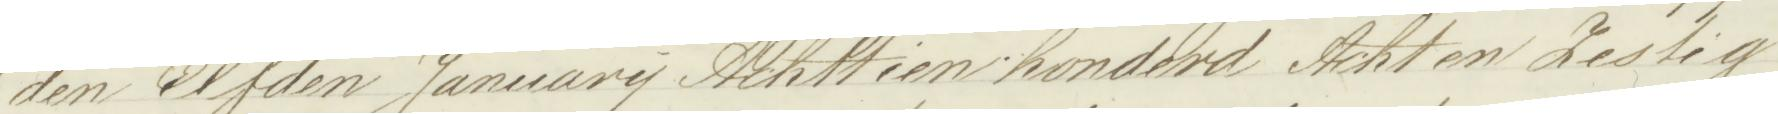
den Elfden Januarij Achttien honderd Acht en Zestig
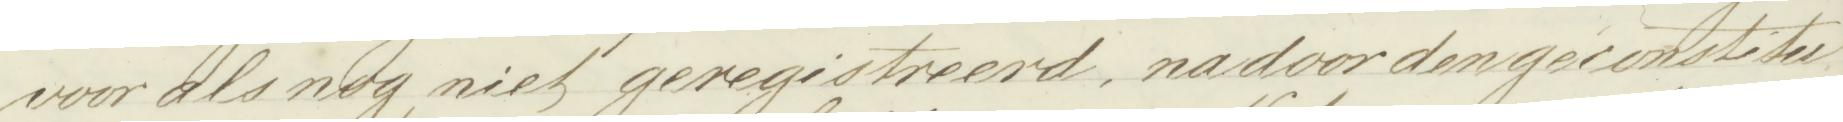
voor als nog niet geregistreerd, na door den geconstitu
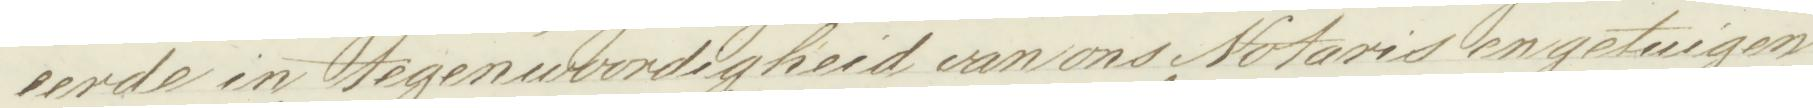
eerde in tegenwoordigheid van ons Notaris en getuigen
